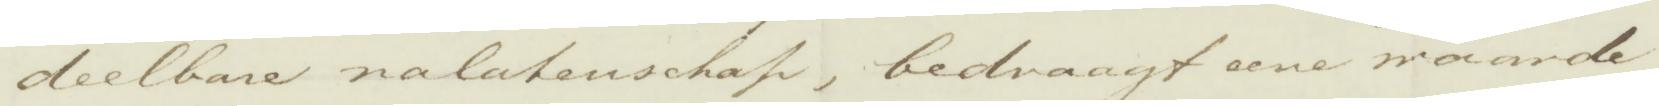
deelbare nalatenschap, bedraagt eene waarde
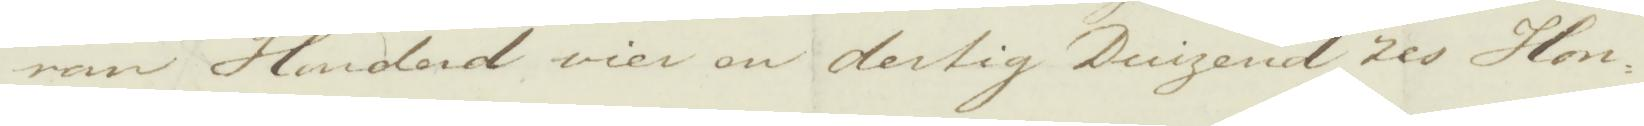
van Honderd vier en dertig Duizend zes Hon„
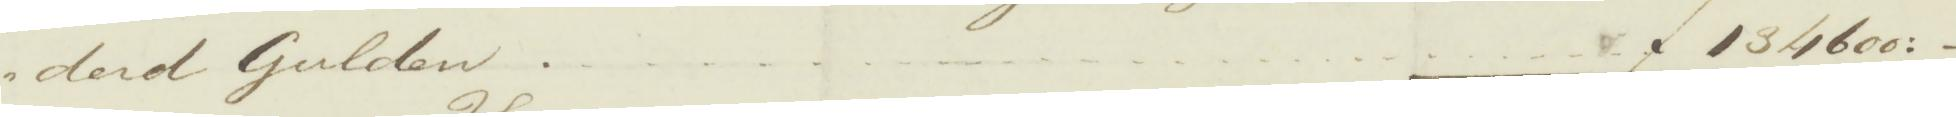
„derd Gulden . . . . . . . . . . . . . . . . . . . . . . . . . . . ƒ 134600:
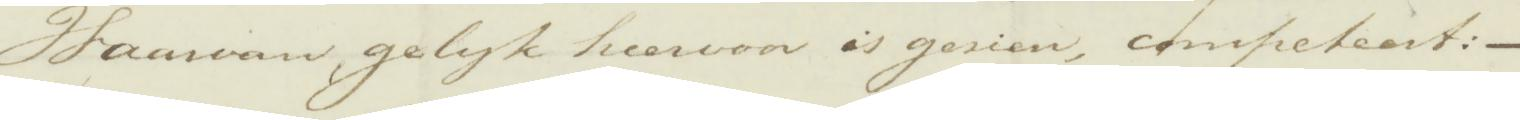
Waarvan gelyk hiervoor is gezien, competeert:-
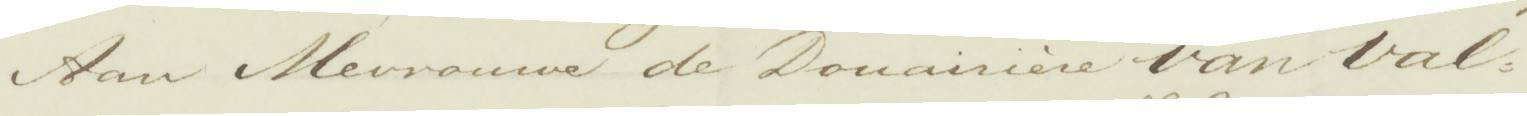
Aan Mevrouwe de Douairière van Val„
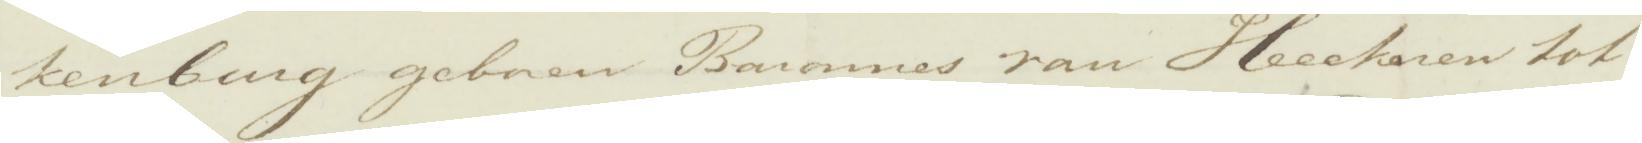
kenburg geboren Baronnes van Heeckeren tot
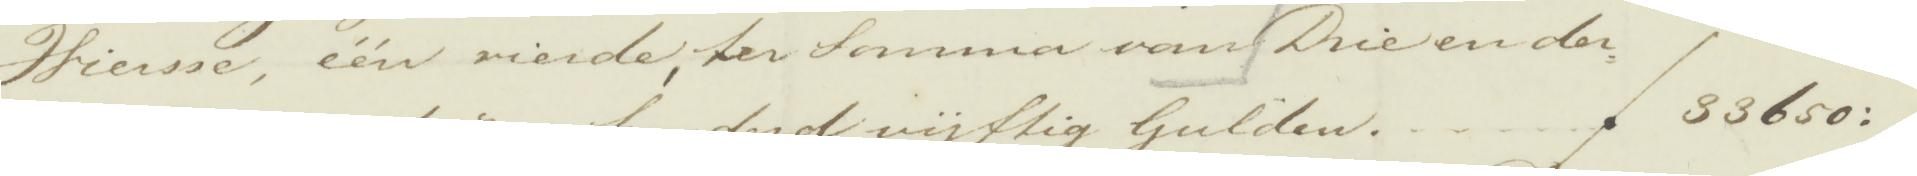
Wiersse, eén vierde ter somma van] Drie en der„ ƒ 33650:
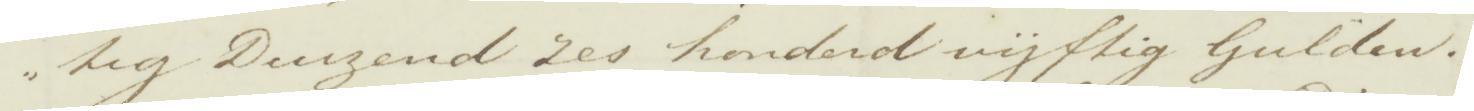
„tig Duizend zes honderd vijftig Gulden.
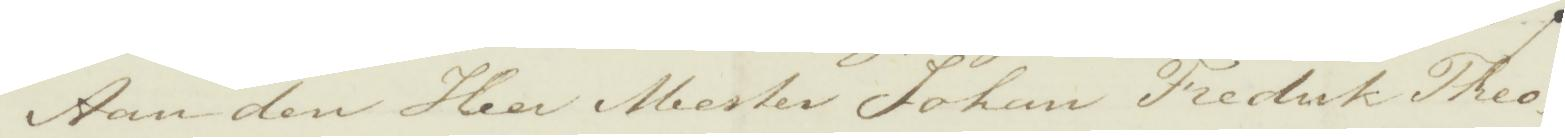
Aan den Heer Meester Johan Fredrik Theo„
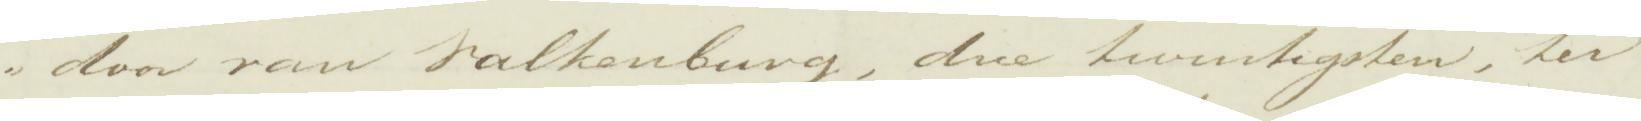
„door van Valkenburg, drie twintigsten, ter
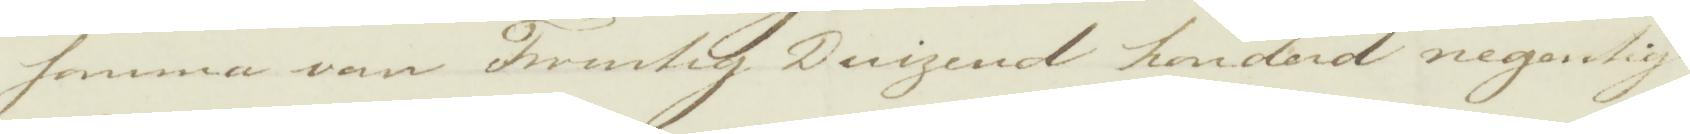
somma van Twintig Duizend honderd negentig
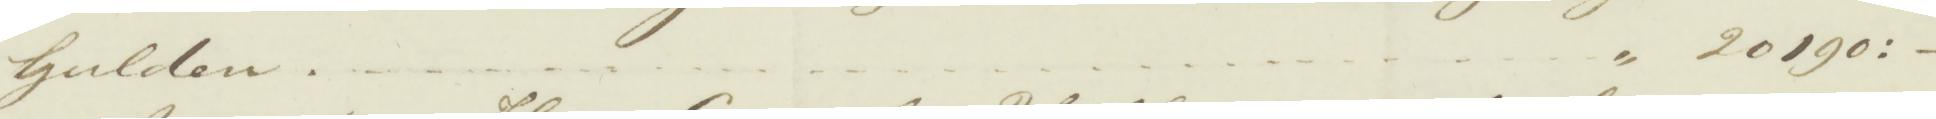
Gulden . . . . . . . . . . . . . . . . . . . . . . . . . . „ 20190: .
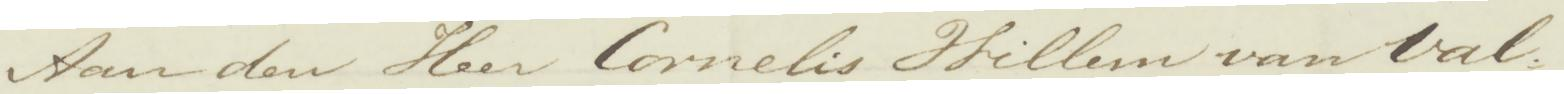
Aan den Heer Cornelis Willem van Val„
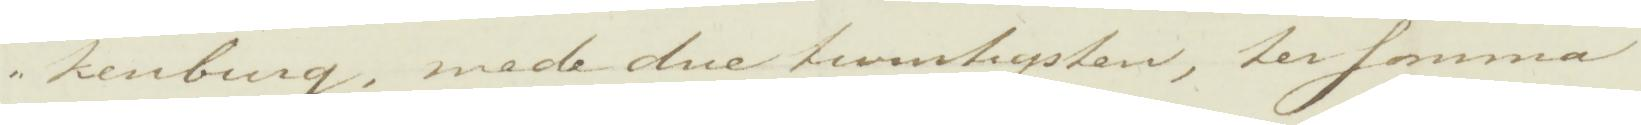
„kenburg, mede drie twintigsten, ter somma
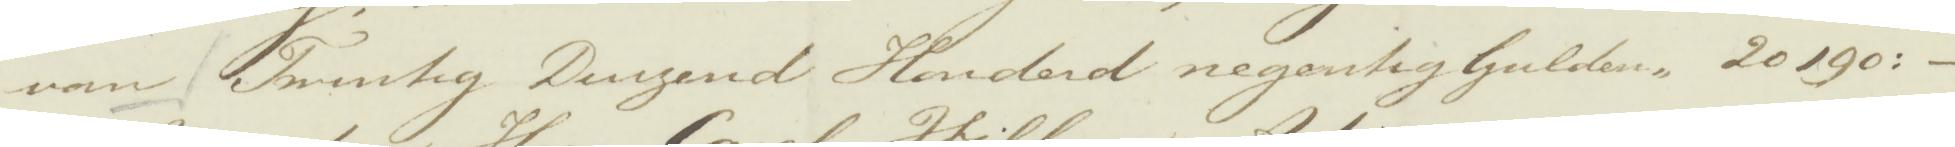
van] Twintig Duizend Honderd negentig Gulden„ 20190: -
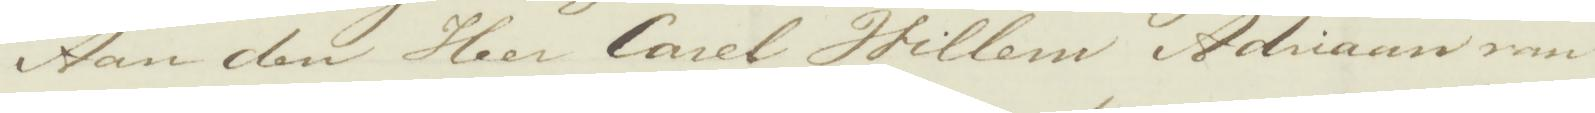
Aan den Heer Carel Willem Adriaan van
